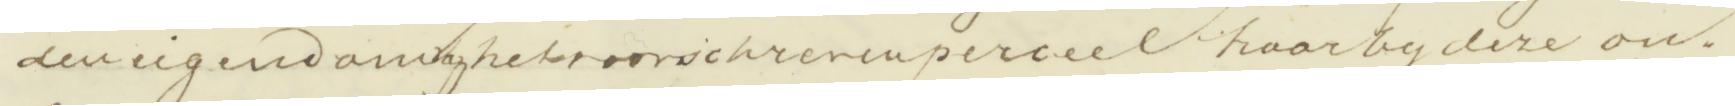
den eigendomvan het voorschrevenperceel haarby deze on„
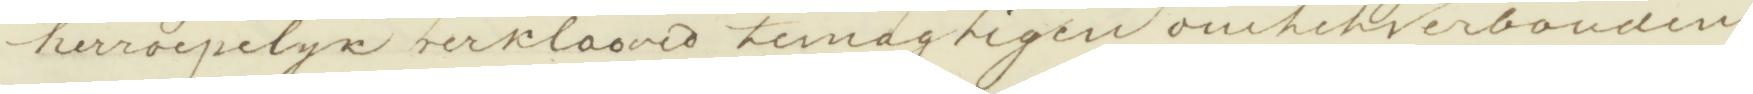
herroepelyk verklaard temagtigen omhetverbonden
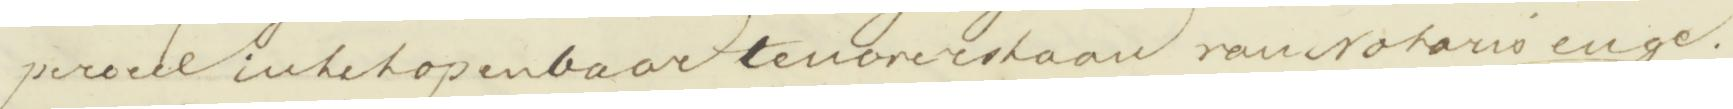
perceel inhetopenbaar tenoverstaan van Notaris en ge.
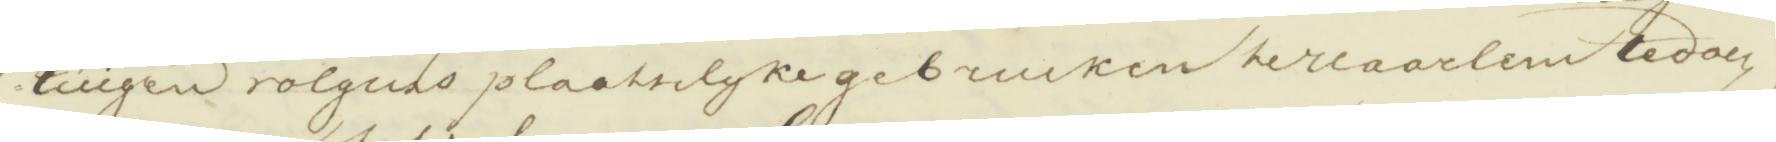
„tuigen volgens plaatselyke gebruiken teHaarlem tedoen
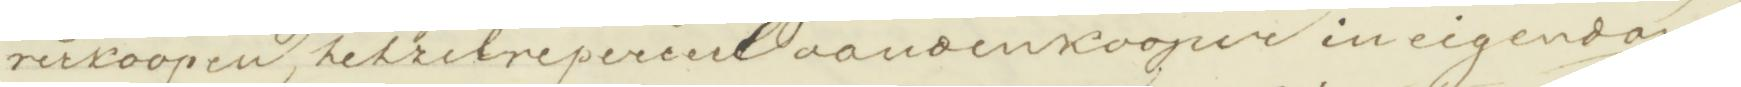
verkoopen, hetzelveperceel aandenkooper in eigendom
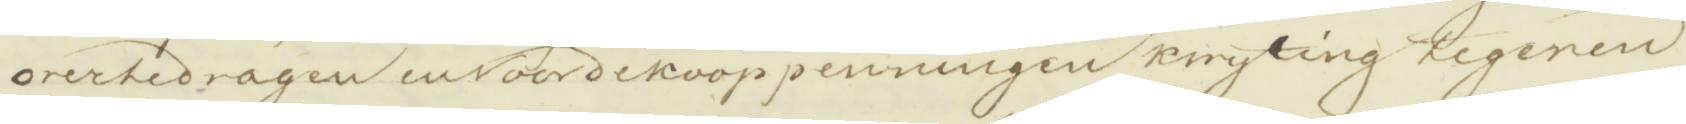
overtedragen envoor dekooppenningen kwyting tegeven
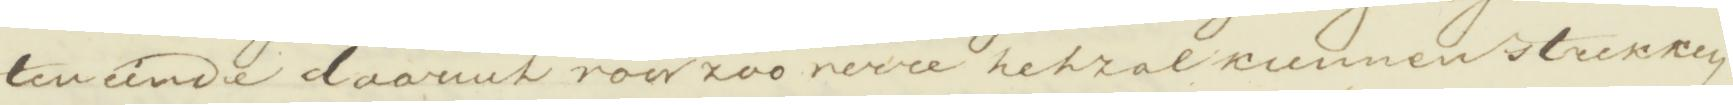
ten einde daaruit voor zoo verre hetzal kunnen strekken
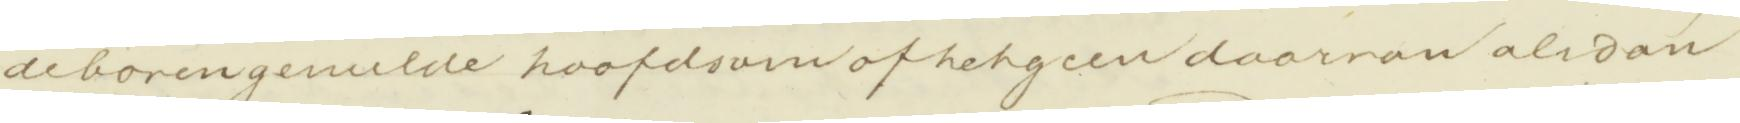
debovengemelde hoofdsom ofhetgeen daarvan alsdan
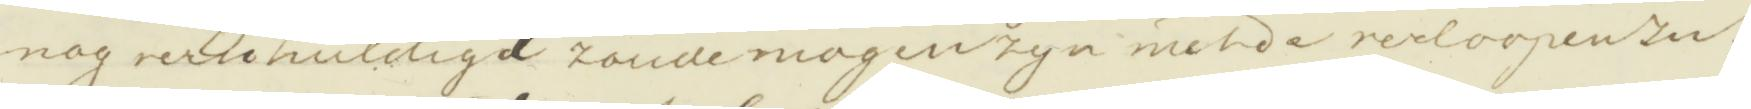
nog verschuldigd zoudemogen zyn met de verloopenIn„
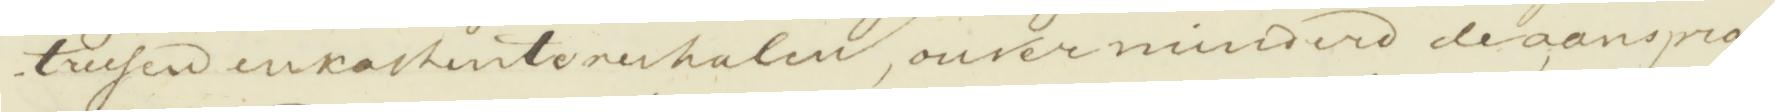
=tressen enkostente verhalen, onverminderd de aanspra
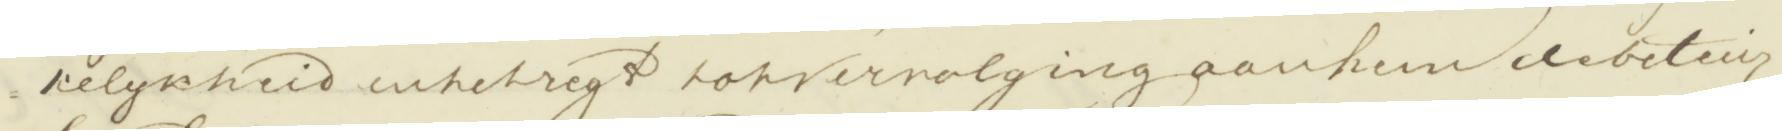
=kelykheid enhetregt totvervolging aanhem debiteur
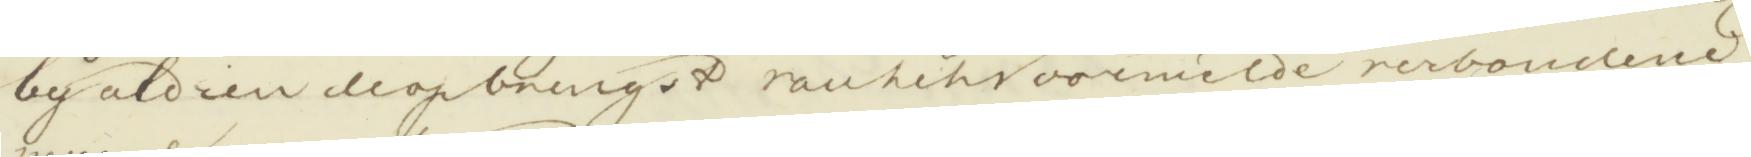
by aldien deopbrengst vanhetvoormelde verbondene
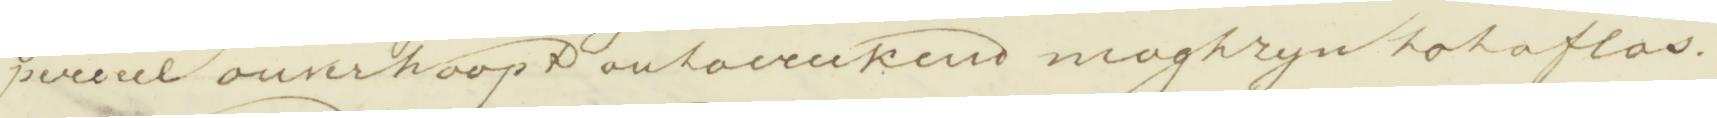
perceel onverhoopt ontoereikend mogtzyn tot aflos.
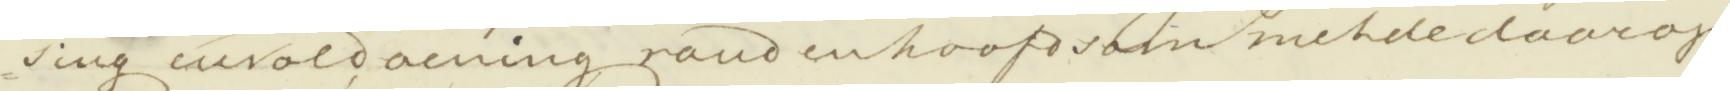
=sing envoldoening vandenhoofdsom metde daarop
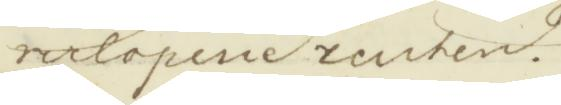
verlopene renten.
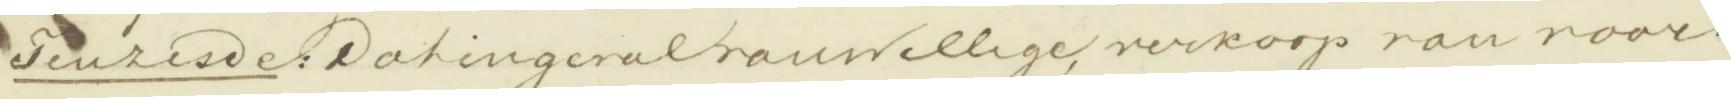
Tenzesde : Dat ingeval vanwillige, verkoop van voor.
